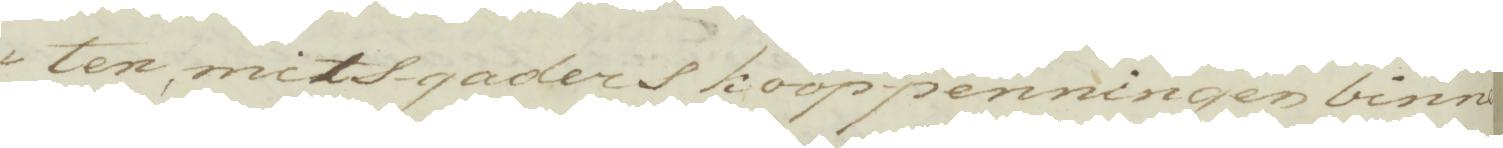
„ ten, mitsgaders kooppenningen binne
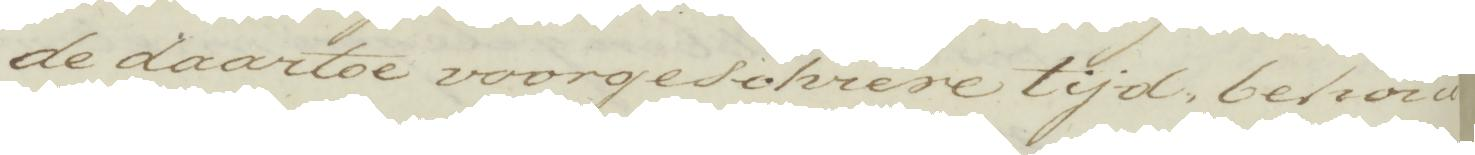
de daartoe voorgeschreve tijd, behoud
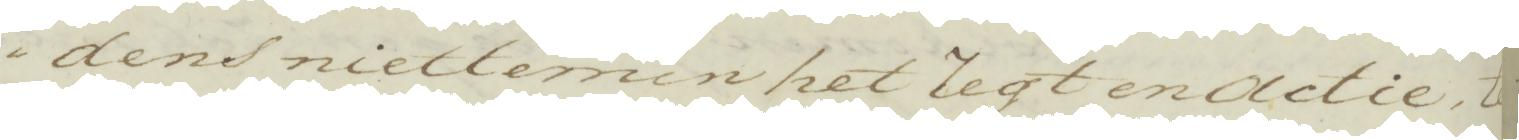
„dens niettemin het regt en actie, t
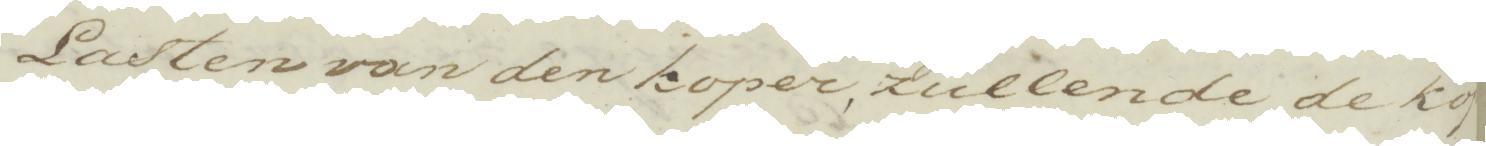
Lasten van den koper, zullende de ko
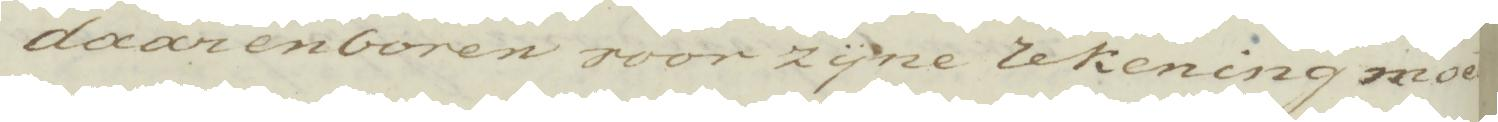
daarenboven voor zijne rekening moe
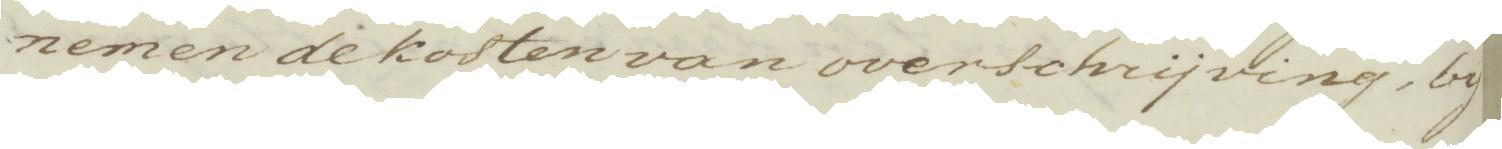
nemen de kosten van overschrijving, bij
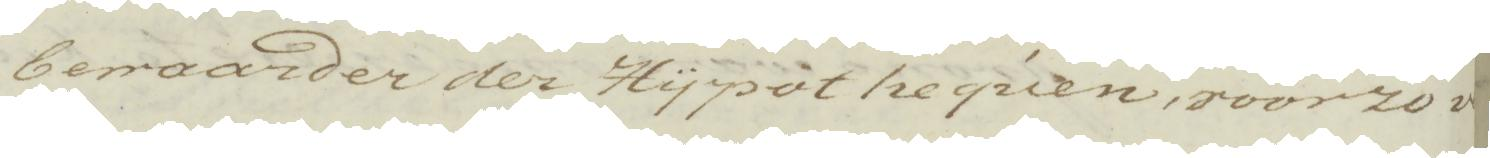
bewaarder der Hijpothequen, voor zo v
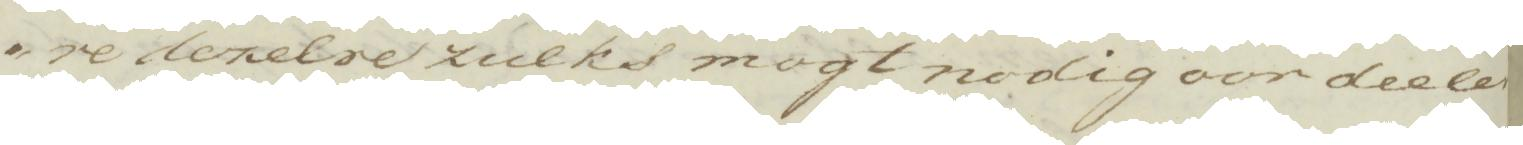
„re dezelve zulks mogt nodig oor deele
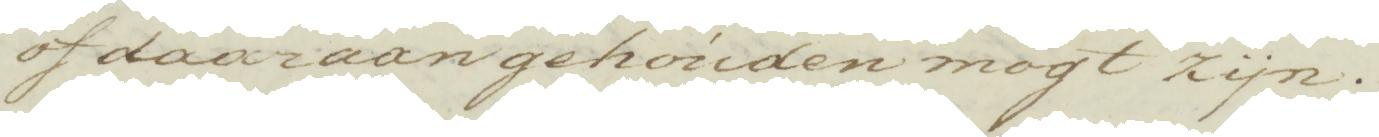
of daar aan gehouden mogt zijn.
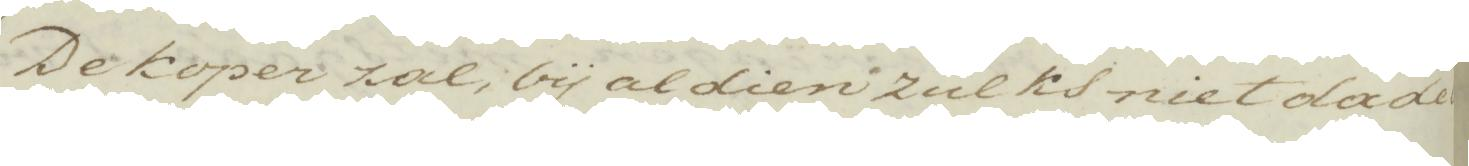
De koper zal, bij aldien zulks niet dade
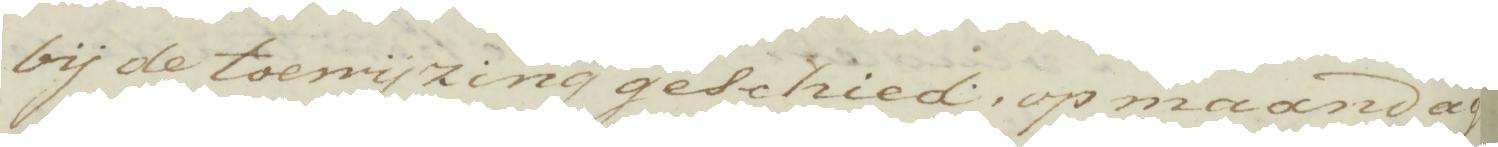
bij de toewijzing geschied, op maand ag
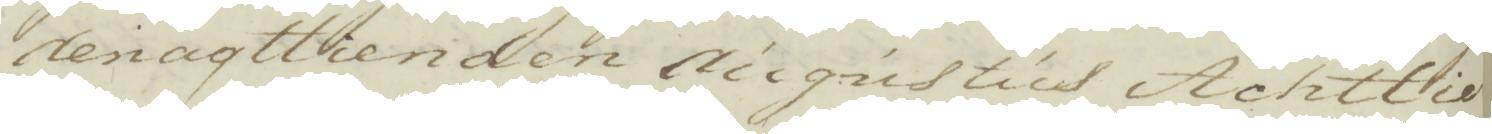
den agttienden augustus Achttie
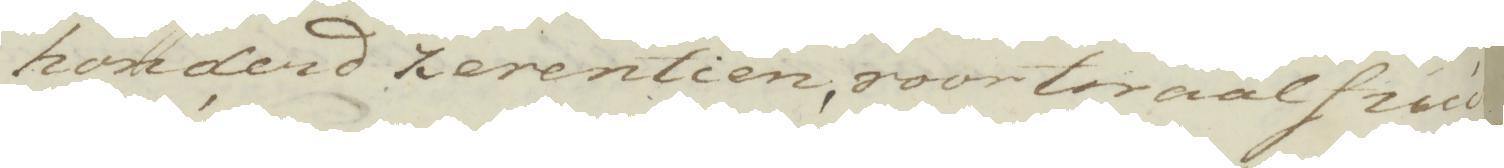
honderd Zeventien, voor twaalf uu
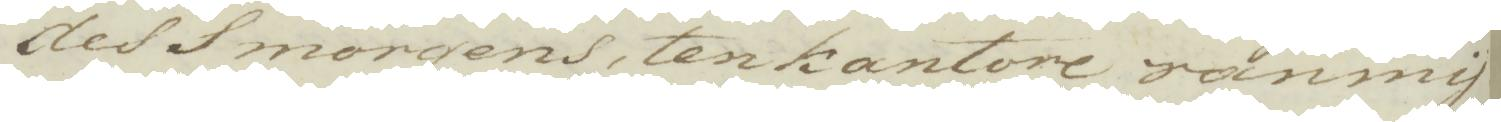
des 's morgens, ten kantore van mij
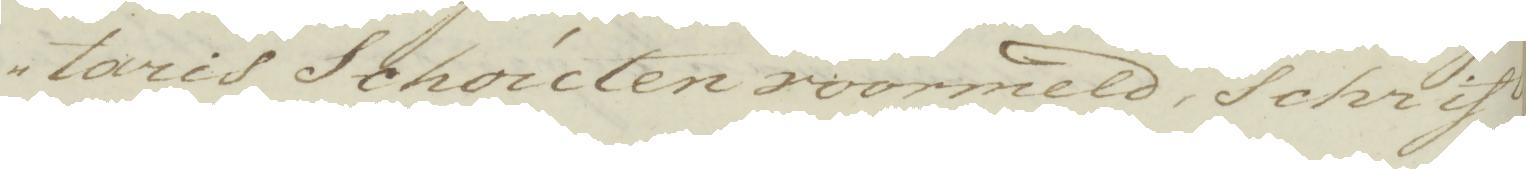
„taris Schouten voormeld, schrif
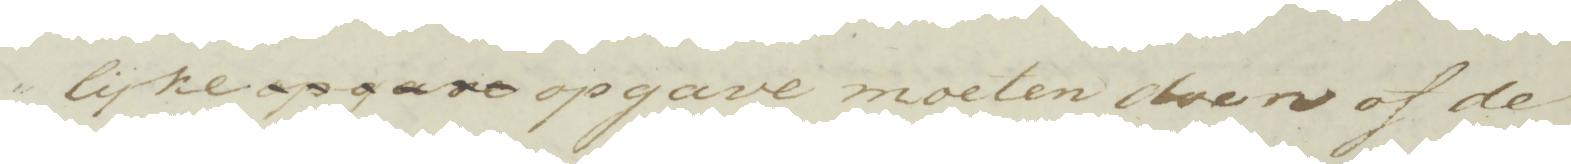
„ lijke opgave opgave moeten doen of de
